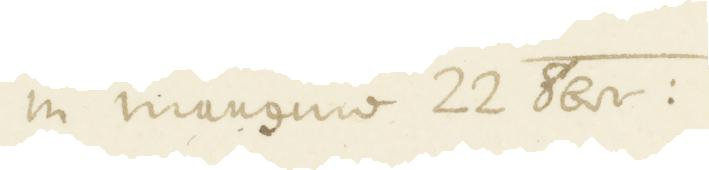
in margine 22 8br:
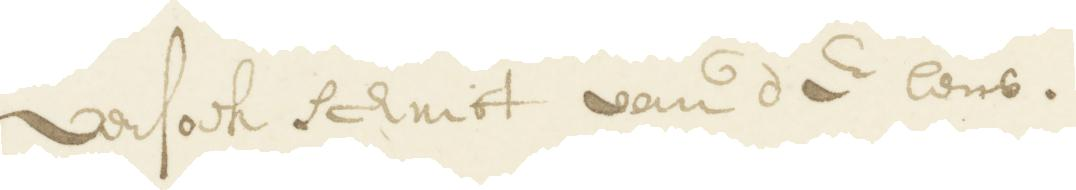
versoek schrift van d E lens.
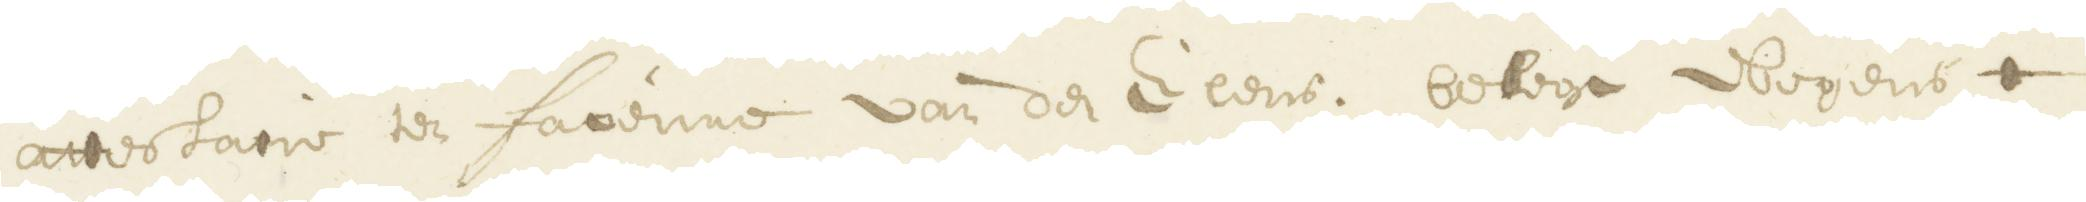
attestatie ten faveure van den E' lens. belege wegens t
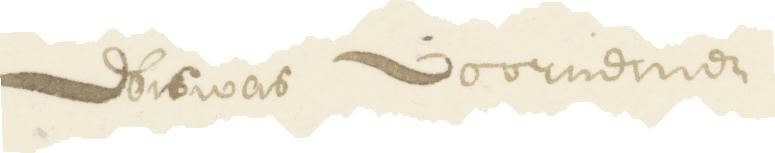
wiswas voornemen.—
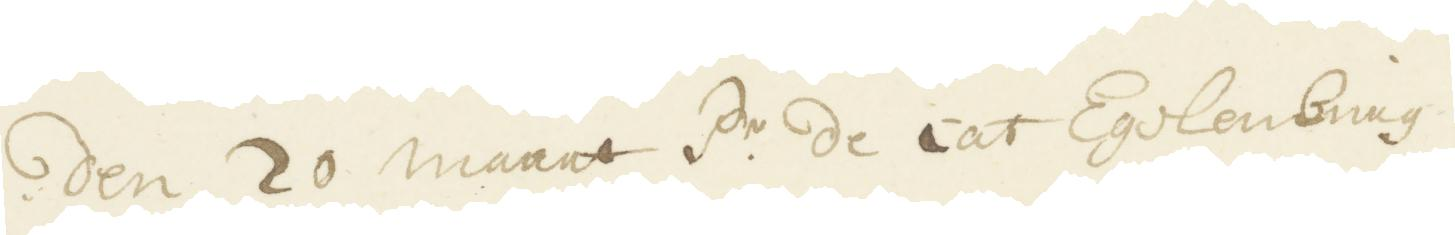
den 20 maart P:r de cat Egelenburg
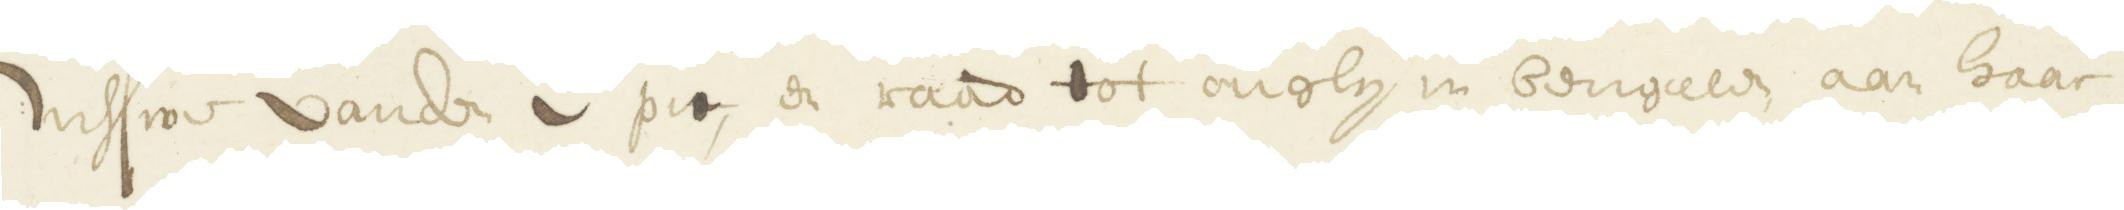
missive van den E pit, en raad tot ougly in bengalen aan haar
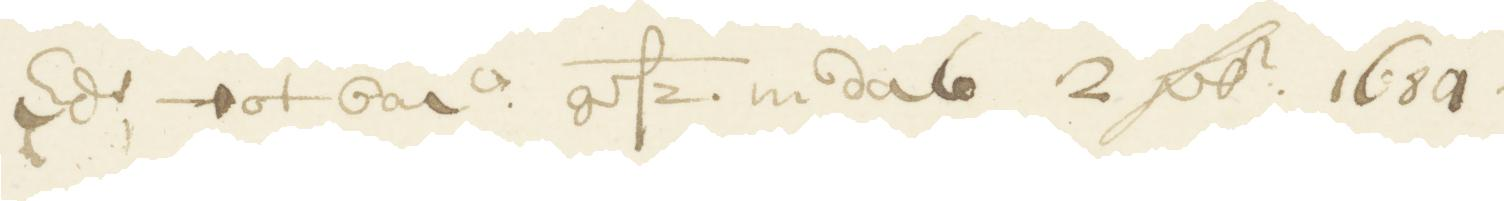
Ed,e tot bat.a gesz. in dato 2 feb: 1684 —
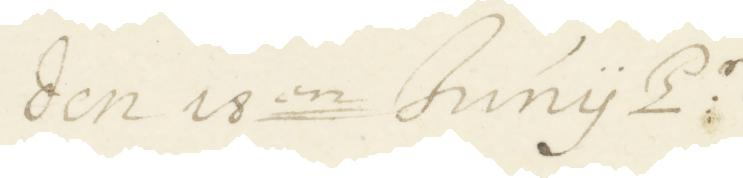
den 18=en Junij P:r
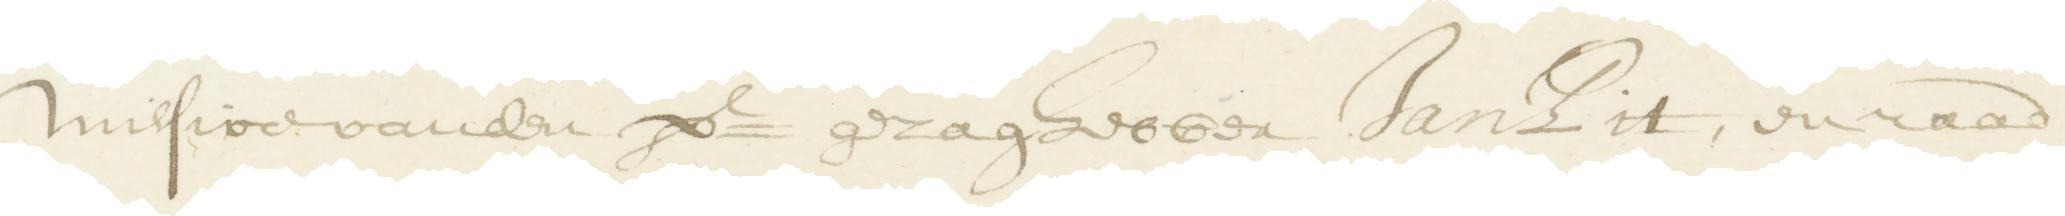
missive van den p=l gezaghebber Jan Pit, en raad
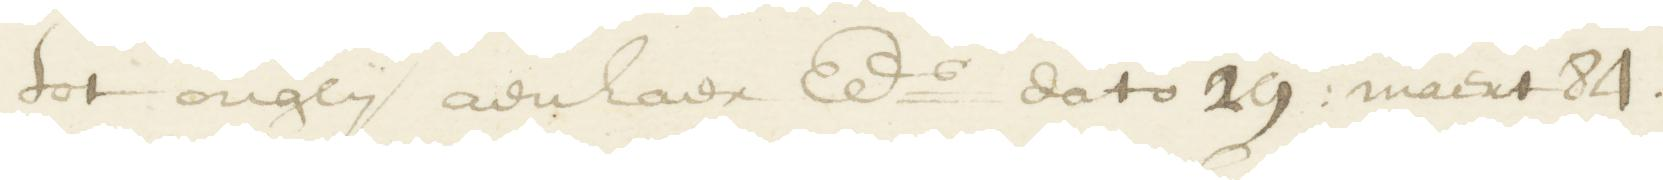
tot ouglij aen haer Ed=s dato 29:' maert 84.
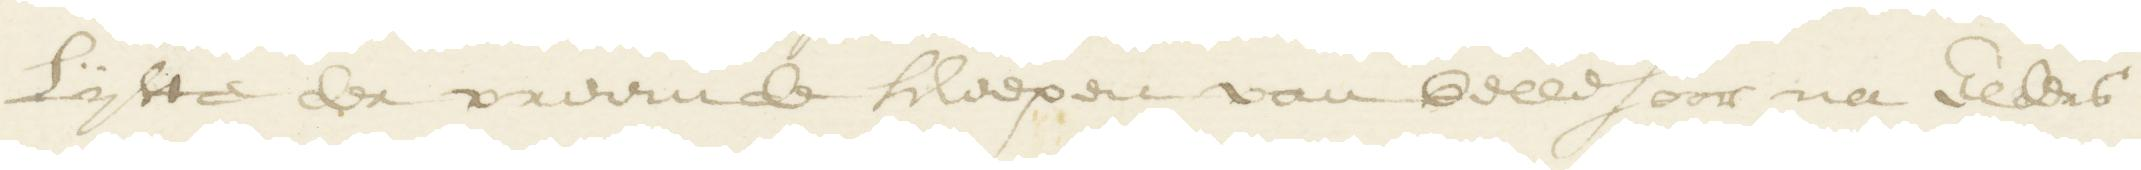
Lijste der vreemde scheepen van bellesoor na Elders
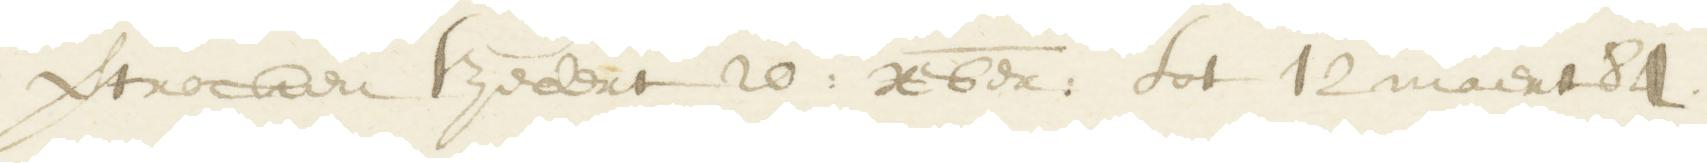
vertrocken tzedert 20:' xber: tot 12 maert 84.
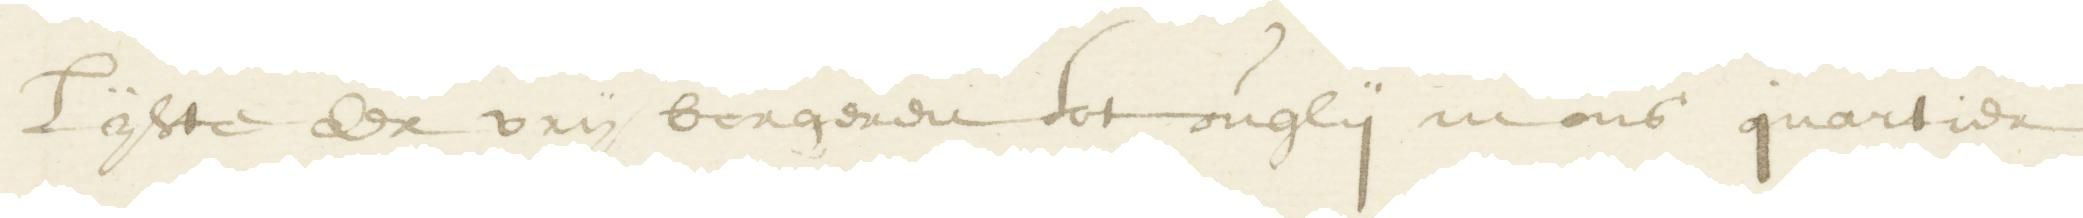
Lijste der vrij borgeren tot ouglij in ons quartier
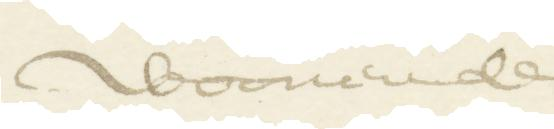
woonende
